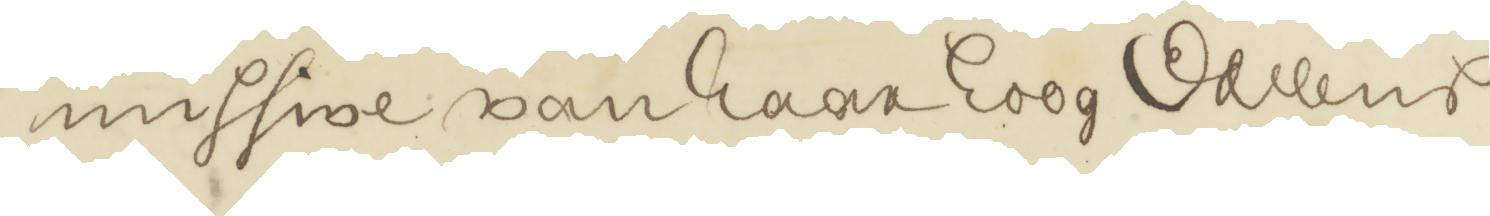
missive van haar hoog Edelens
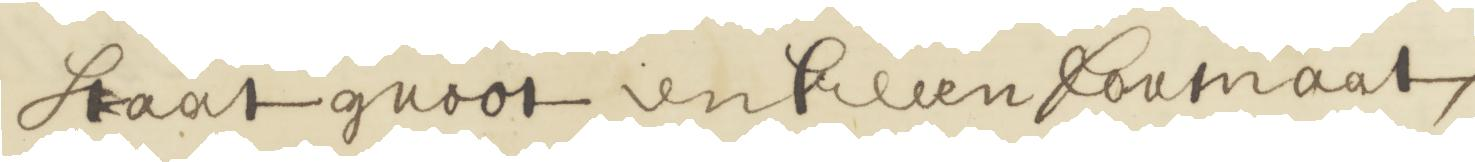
staat groot en kleen formaat
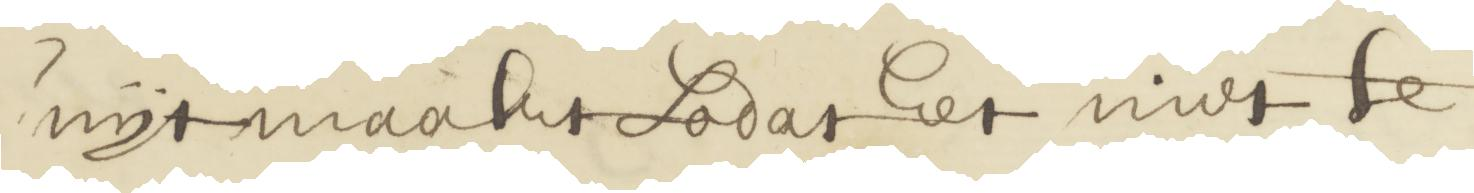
uijtmaakt sodat het niet te
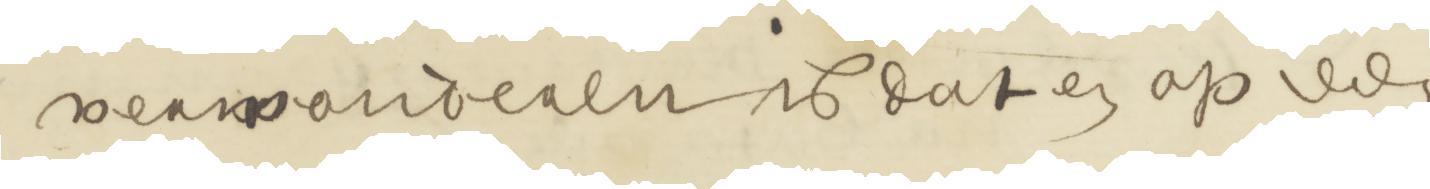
verwonderen is dat en op een
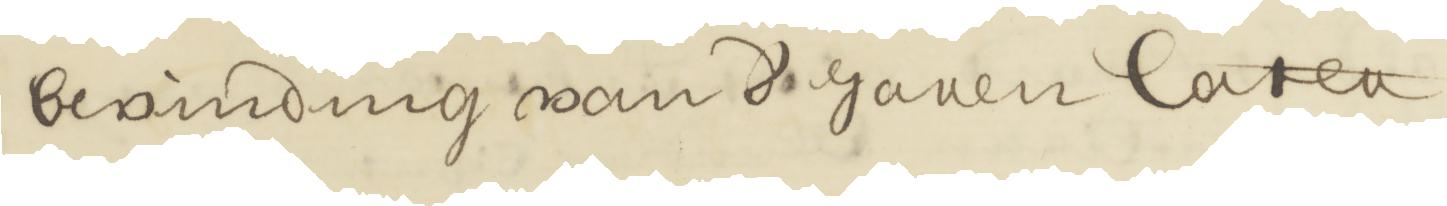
bevinding van 8 Jaren later
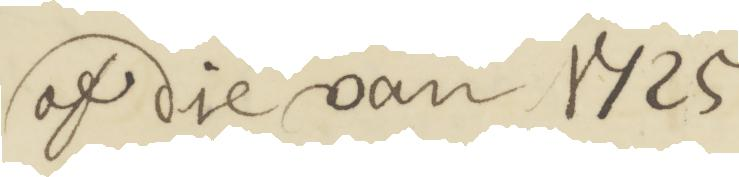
of die van 1725
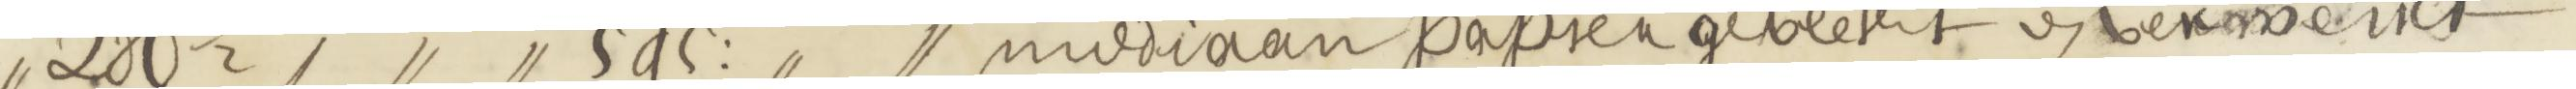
„286½ „ „ „ 545: „ „ mediaan papier gevlekt en verweirt
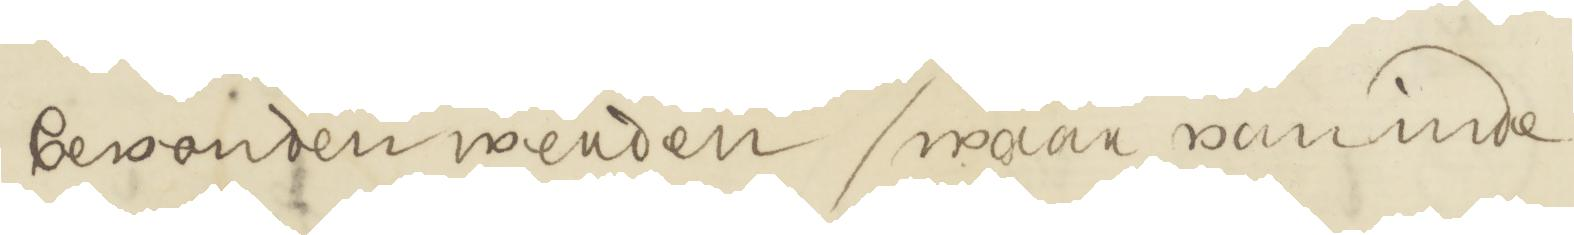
bevonden werden / waar van inde
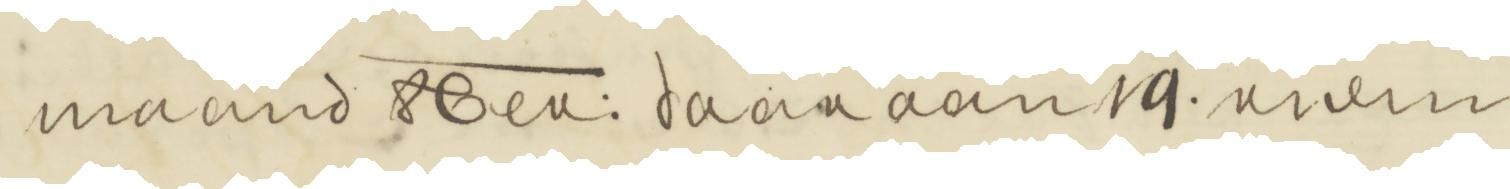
maand 8ber: daar aan 14. riem
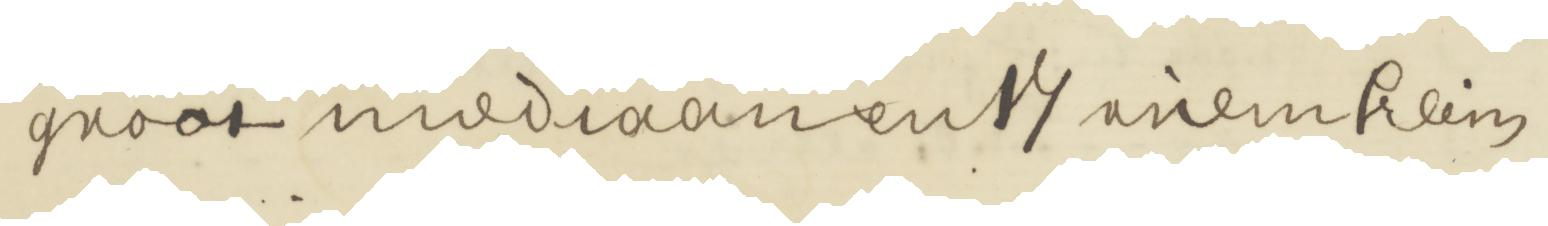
groot mediaan en 17 riem klein
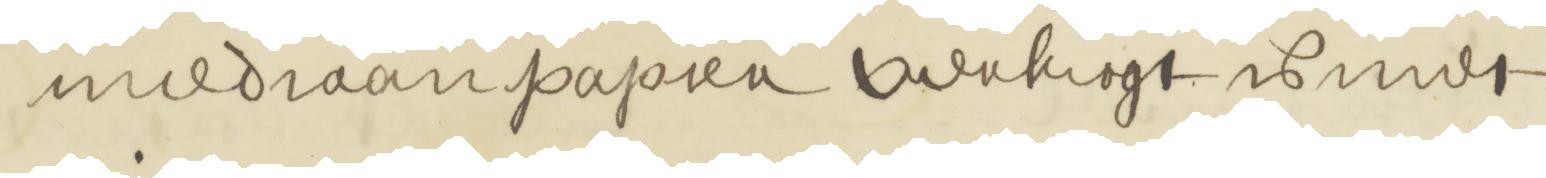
mediaan papier verkogt is met
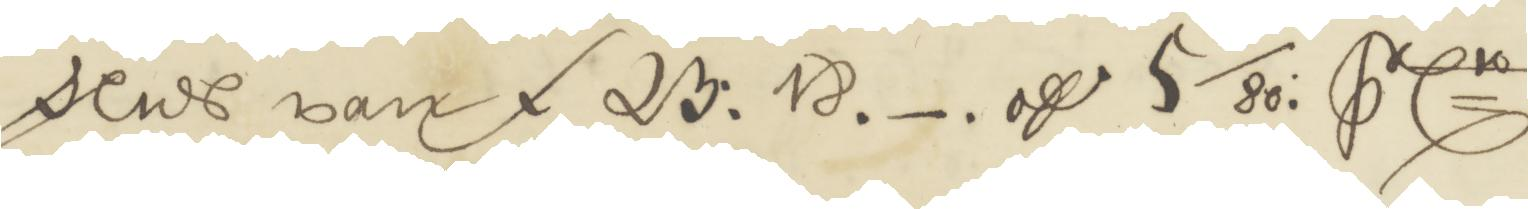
verlies van ƒ 23: 18. — . of 5 43/80: pr C=to
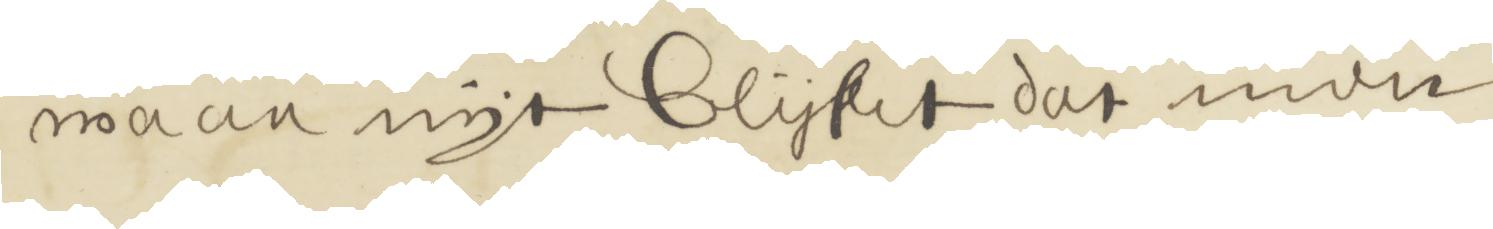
waar uijt blijkt dat men
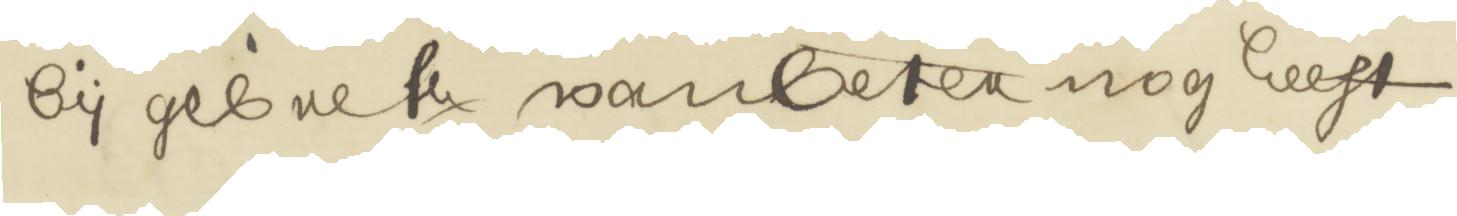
bij gebrek van beter nog heeft
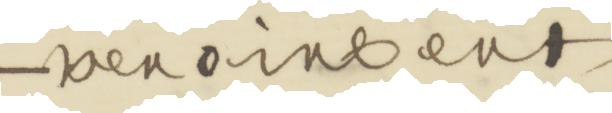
— veroirbert
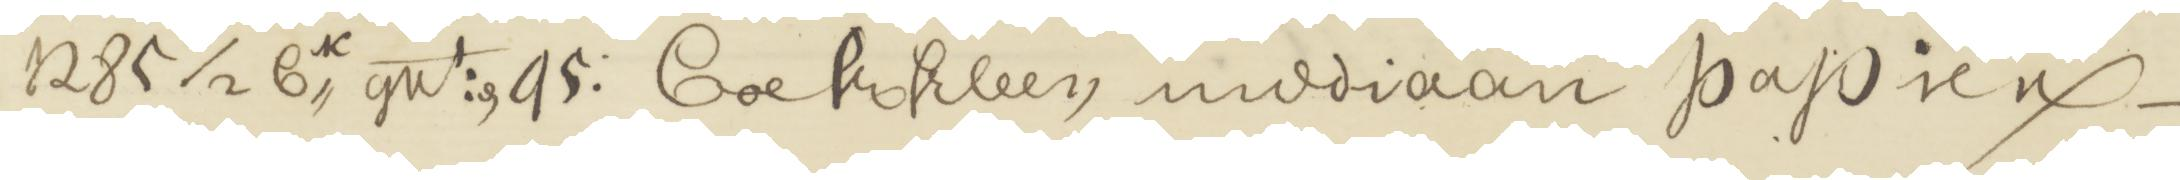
1285½ b„k gr:ten 45: boek kleen mediaan papier —
